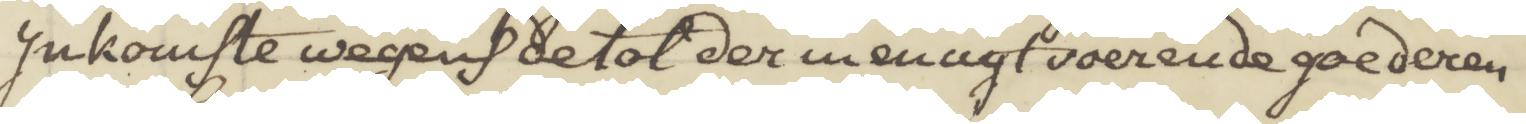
Jnkomste wegens de tot der in agtvoerende goederen
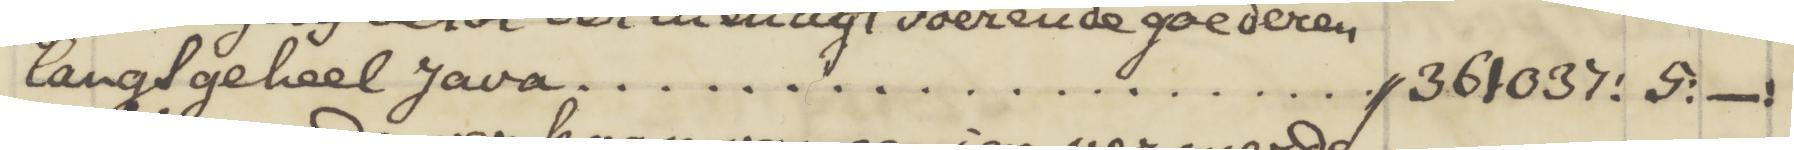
langs geheel Java . . . . . . . . . . . . . . . . . . . . „ 361037: 5: —:
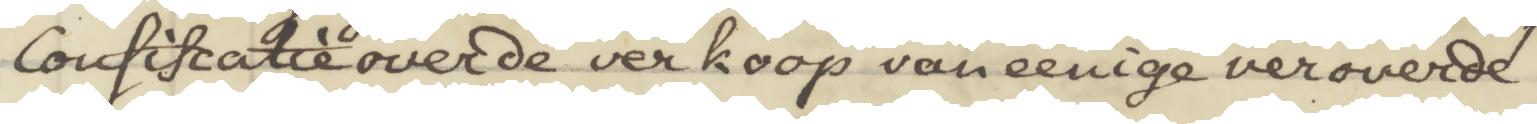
Confiscatie over de verkoop van eenige veroverde
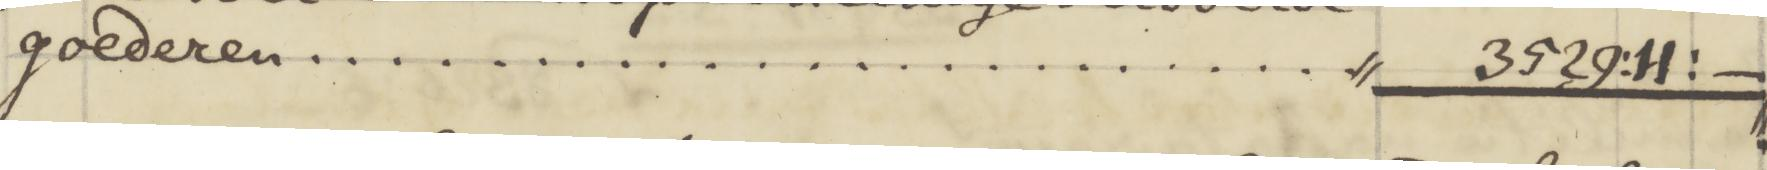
goederen . . . . . . . . . . . . . . . . . . . . . . . .„ 3529:11: —
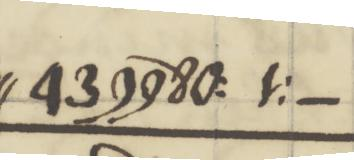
„ 439980: 1:
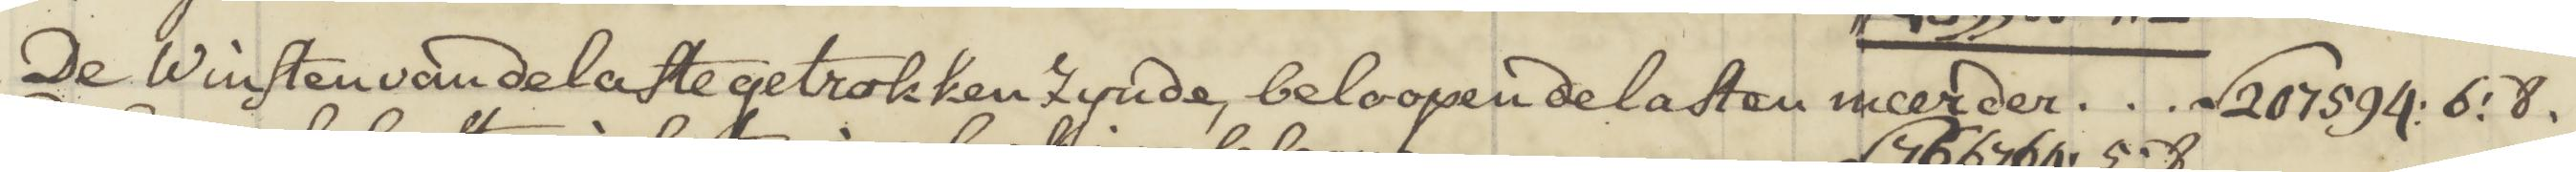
De winsten van de laste getrokken zynde, beloopen de lasten meerder . . . ƒ207594: 6: 8.
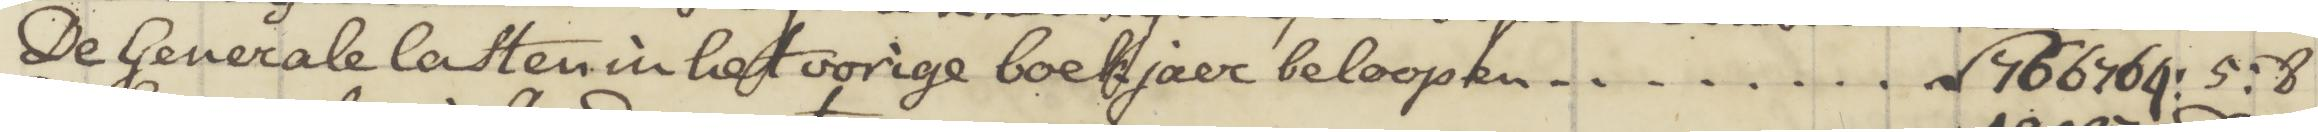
De Generale lasten in het vorige boekjaer beloopen . . . . . . . . . ƒ766764: 5: 8
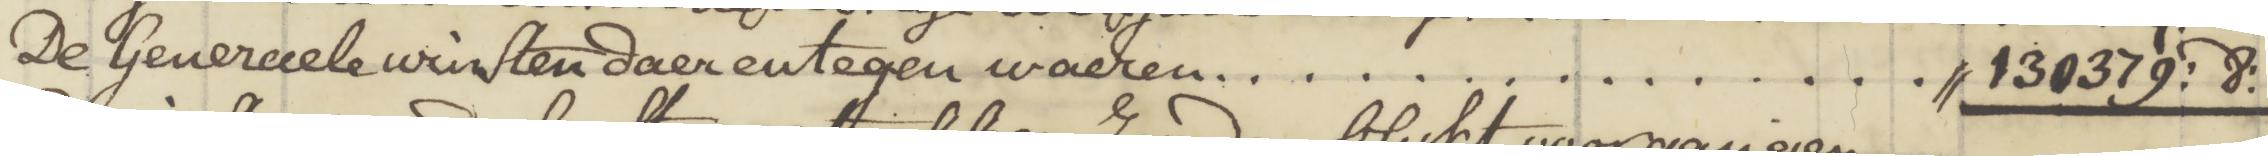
De Generaele winsten daerentegen waeren . . . . . . . . . . . . . . . „ 130379: 8:
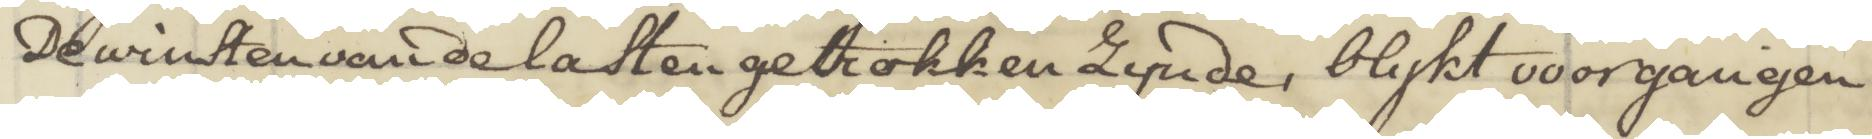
De winsten van de lasten getrokken zynde, blykt voorgangen
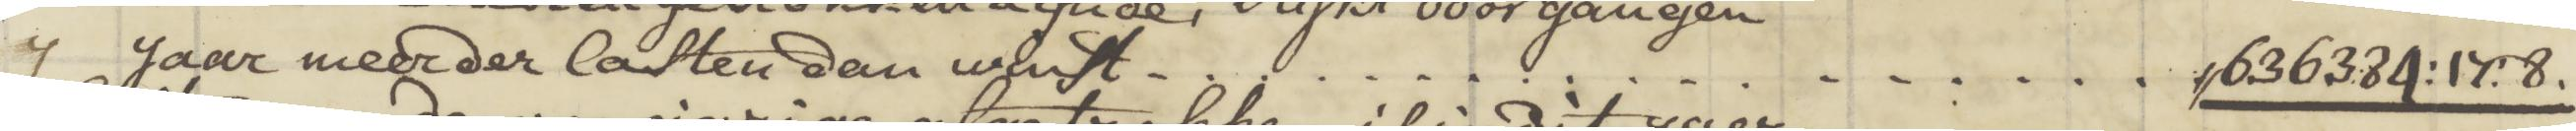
J Jaar meer der lasten dan winst . . . . . . . . . . . . . . . . . . .„ 636384: 17: 8.
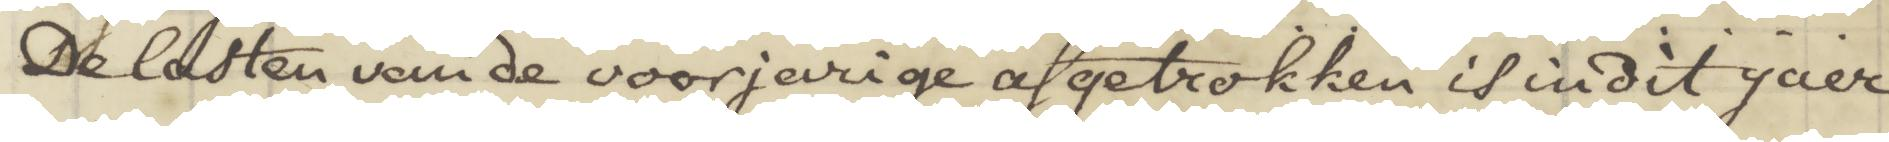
De lasten van de voorjarige afgetrokken is in dit Jaer
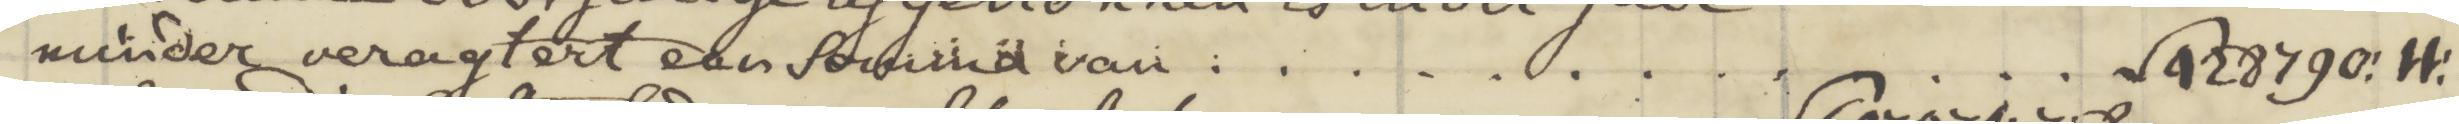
minder veragtert een somma van . . . . . . . . . . . . . ƒ428790: 11:
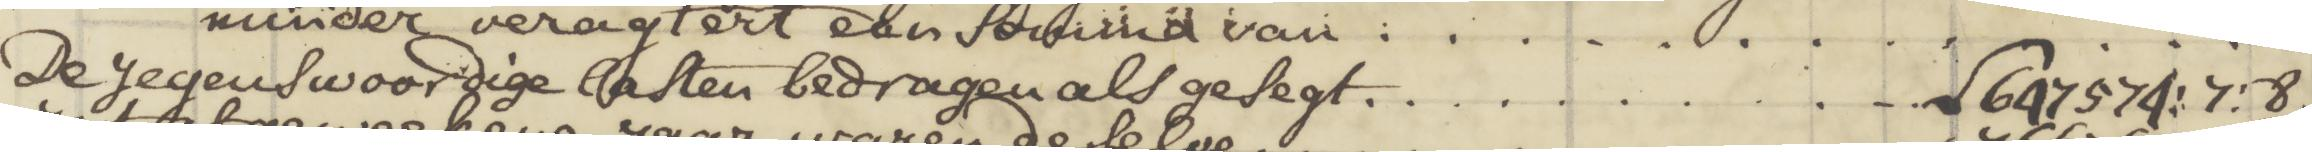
De Jegenswoordige lasten bedragen als gesegt . . . . . . . . . - . ƒ647574: 7: 8.
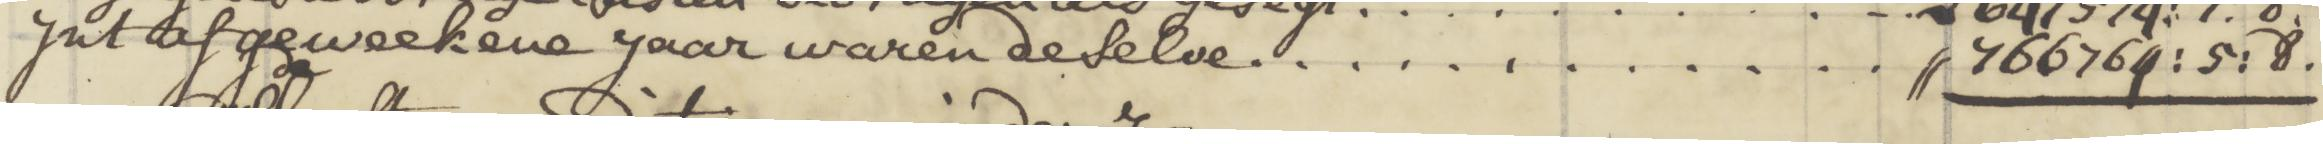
Jnt afgeweekene Jaar waren deselve . . . . . . . . . . . . „ 766764: 5: 8.
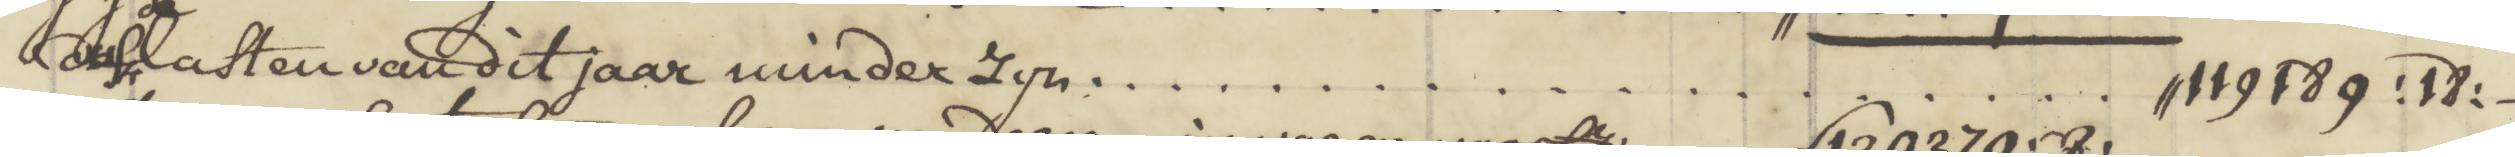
dus lasten van dit jaar minder zijn . . . . . . . . . . . . . . . . . . . „ 119189: 18:
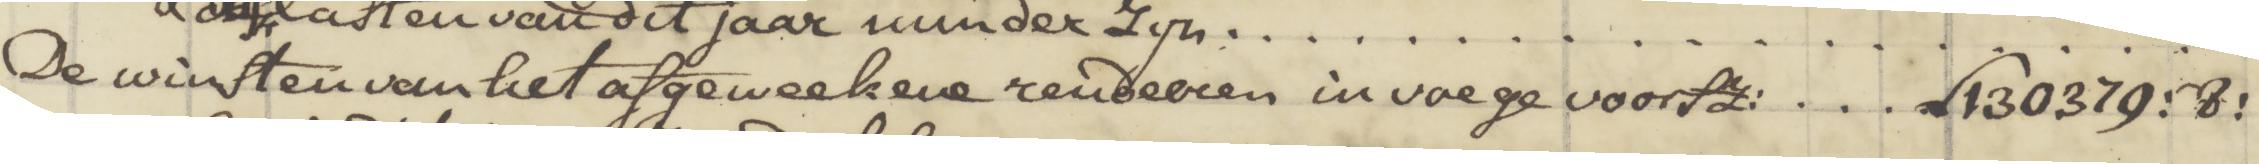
De winsten van het afgeweekene rendeeren in voege voorsz: . . . ƒ130379: 8:
